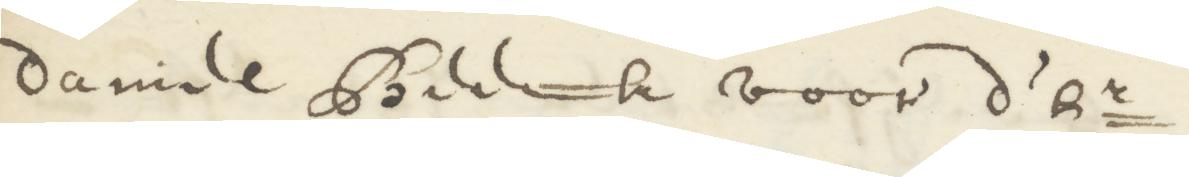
daniel Beeck voor d’ h=r
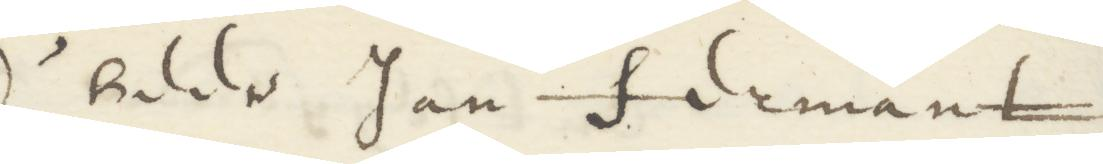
D' heer Jan fermant
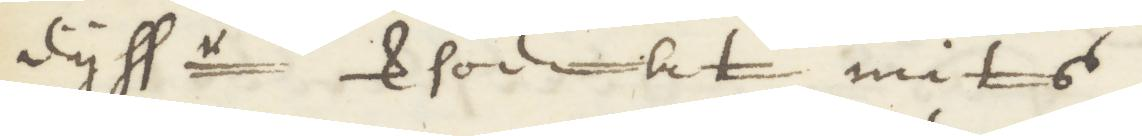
eijss=r versoeckt mits
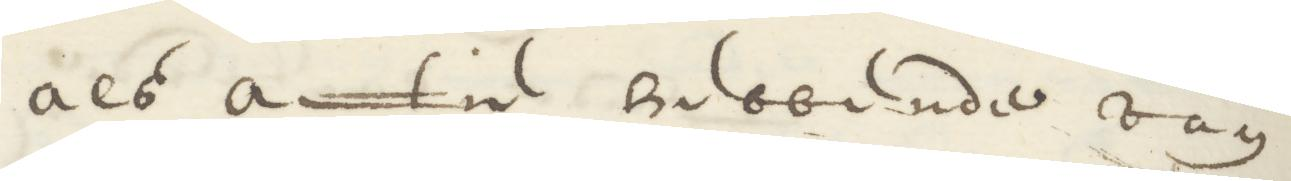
als actie hebbende van
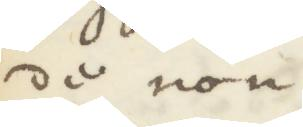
de non
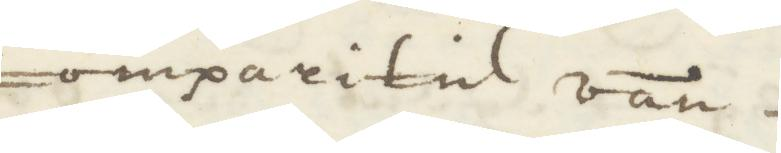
comparitie van
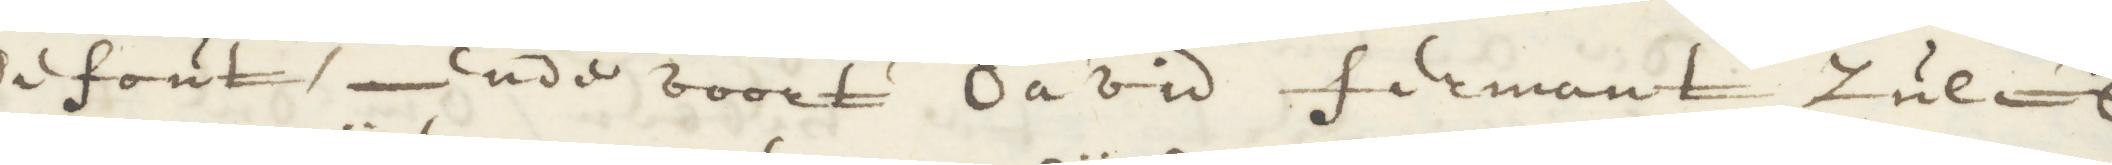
defout, ende voort david fermant zulcx
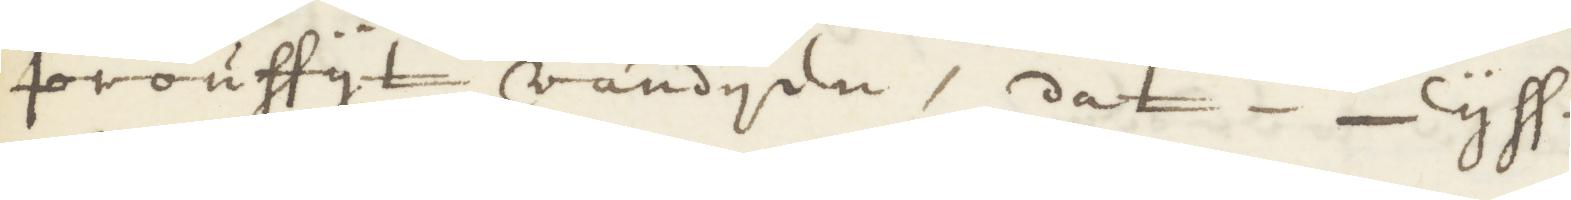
prouffijt vandijen, dat — eijss
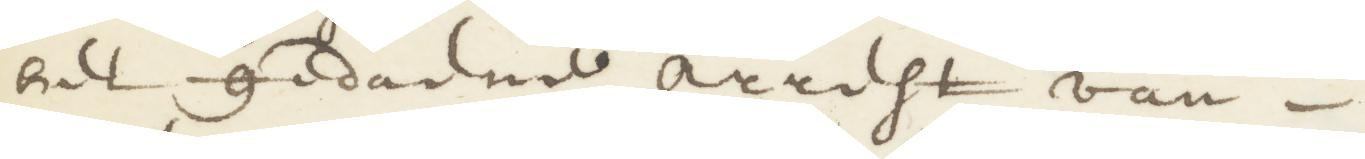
het gedaene arrest van —
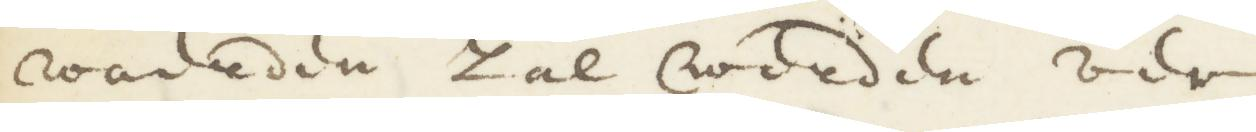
waerden zal werden ver
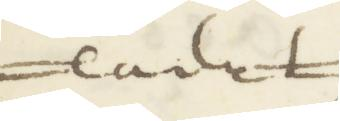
claert
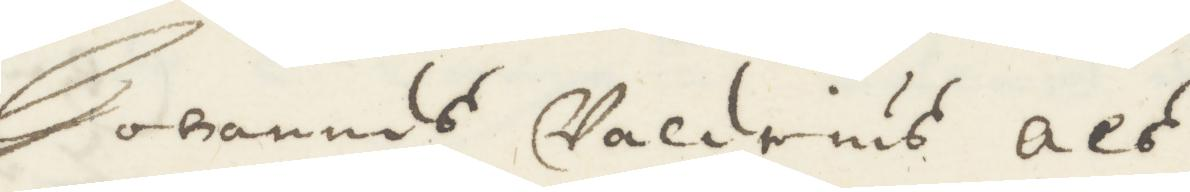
Johannes Valerius als
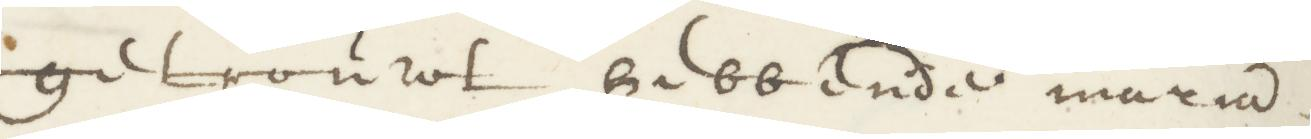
getrouwt hebbende maria
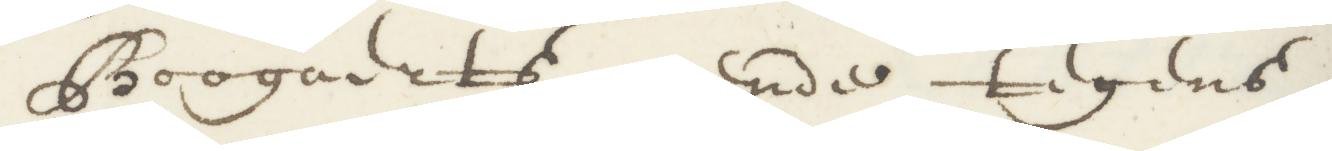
Boogaerts ende tegens
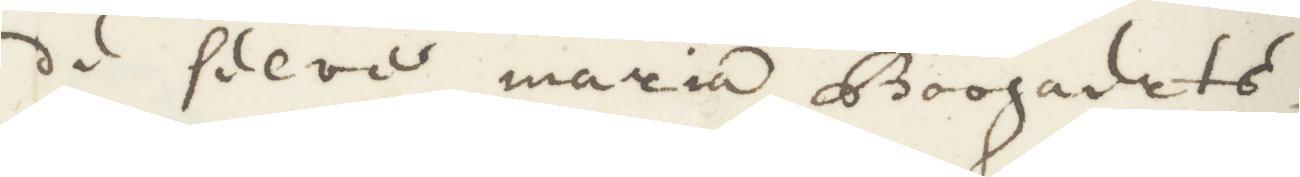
de selve maria Boogaerts
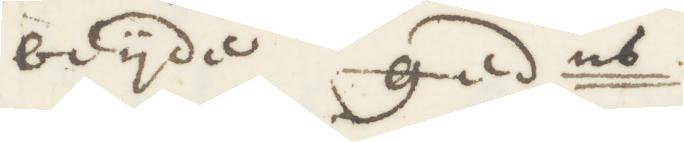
beijde ged=ns
